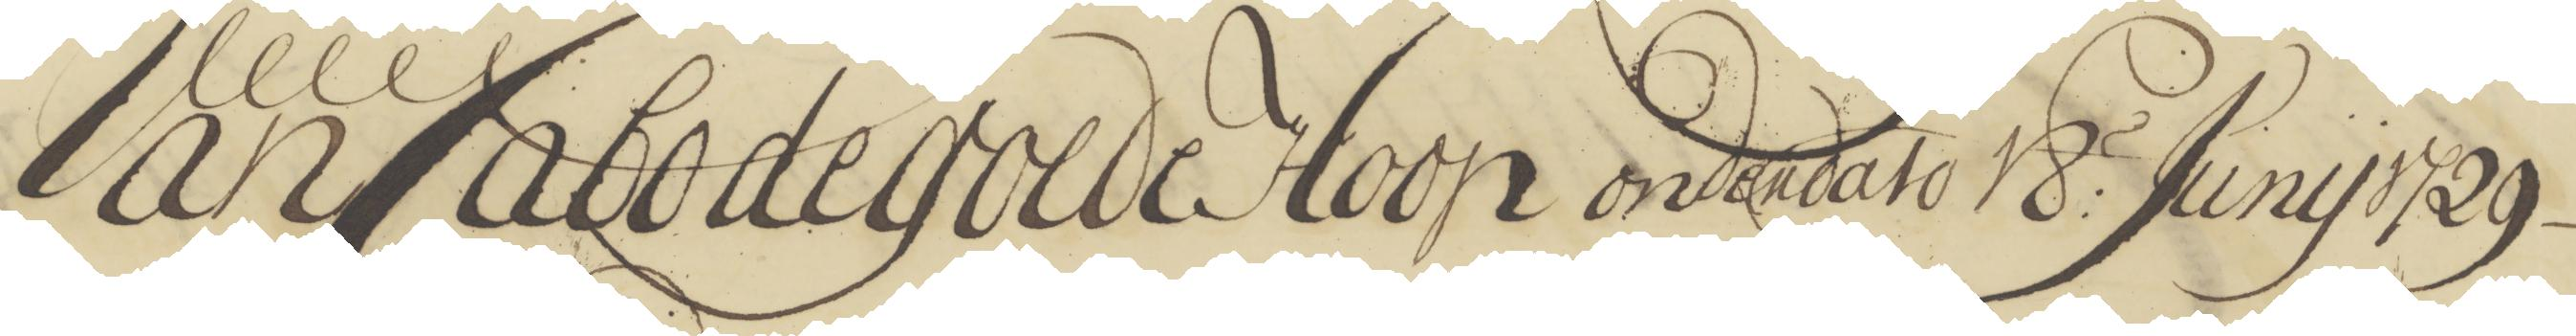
Van Cabodegoede Hoop onderdato 18:' Junij 1729 —
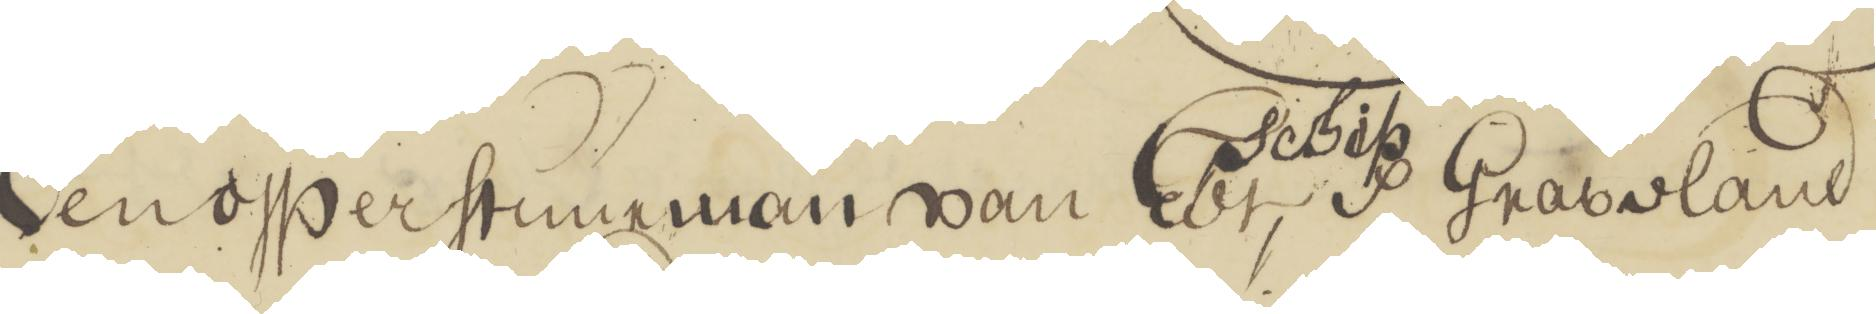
den opperstuurman van het„ s Graveland
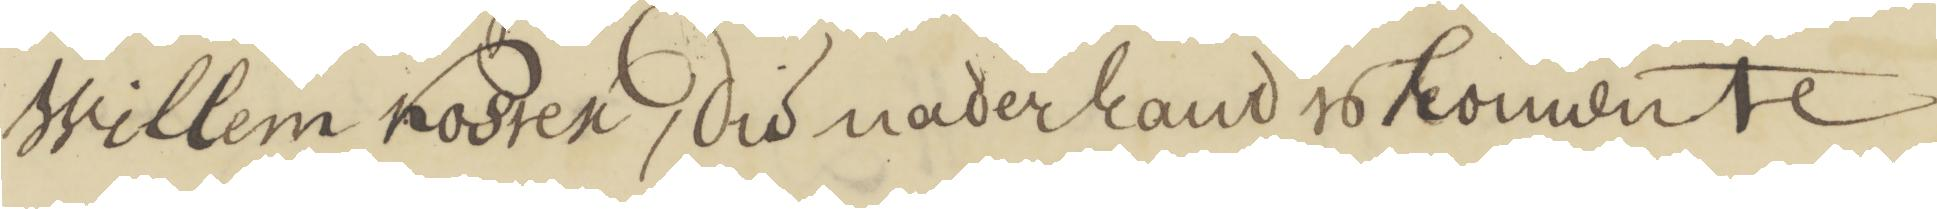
Willem koster, die naderhand is komen te
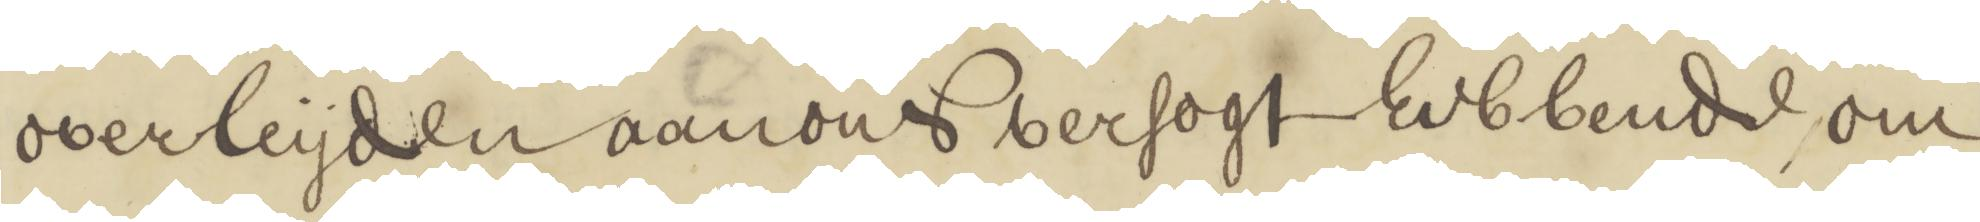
overleijden aan ons versogt hebbende, om
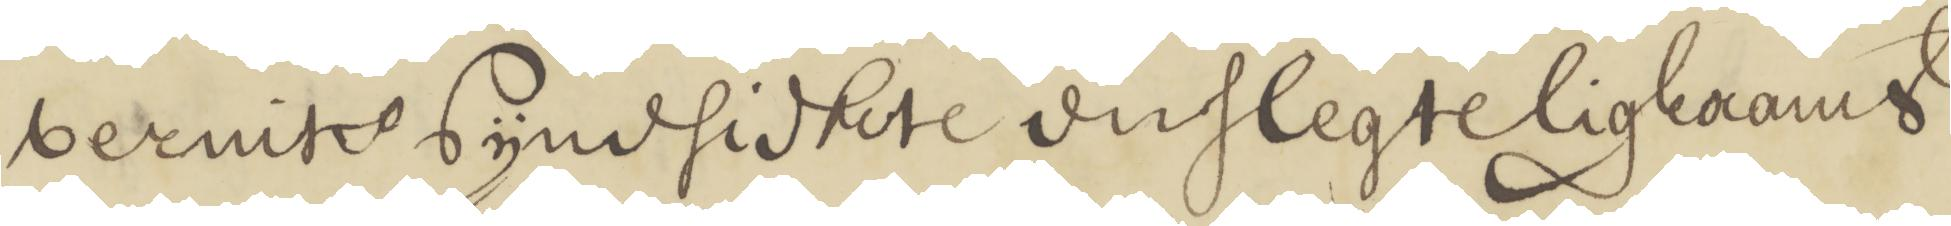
vermits sijne siekte en slegte lighaams
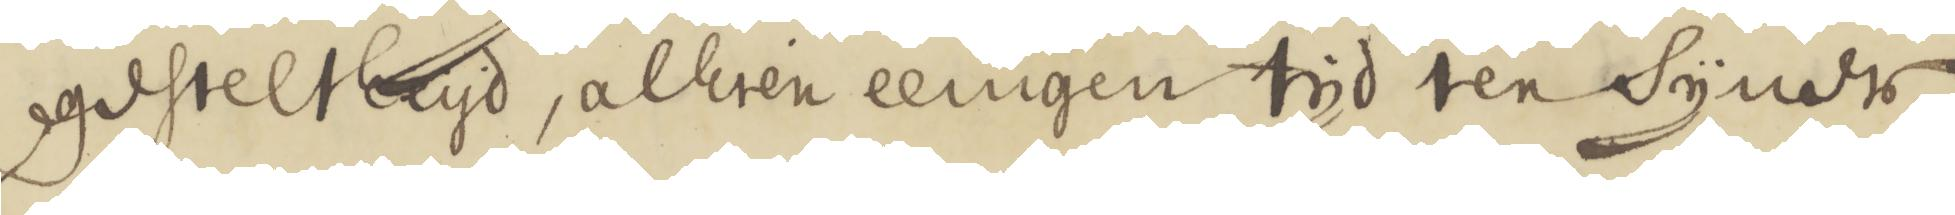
gesteltheijd, alhier eenigen tijd ter sijner
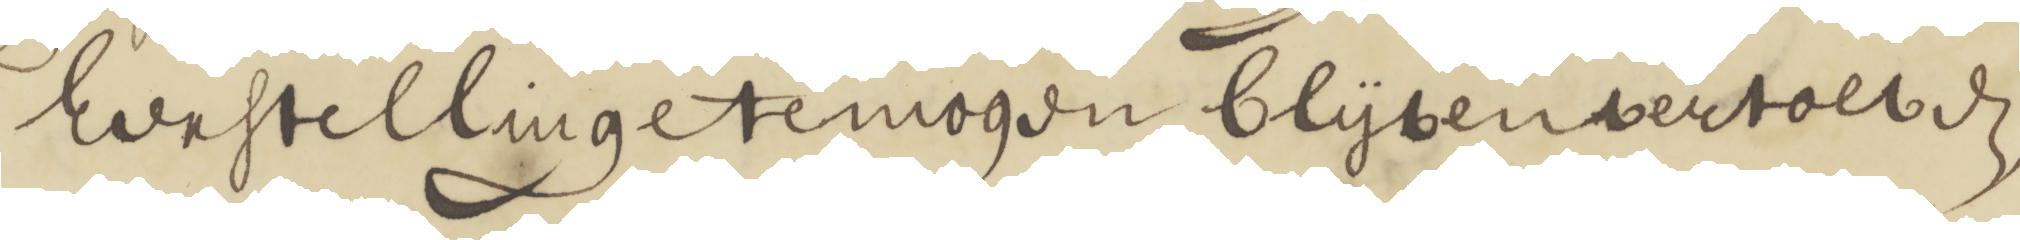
herstellinge te mogen blijven vertoeven
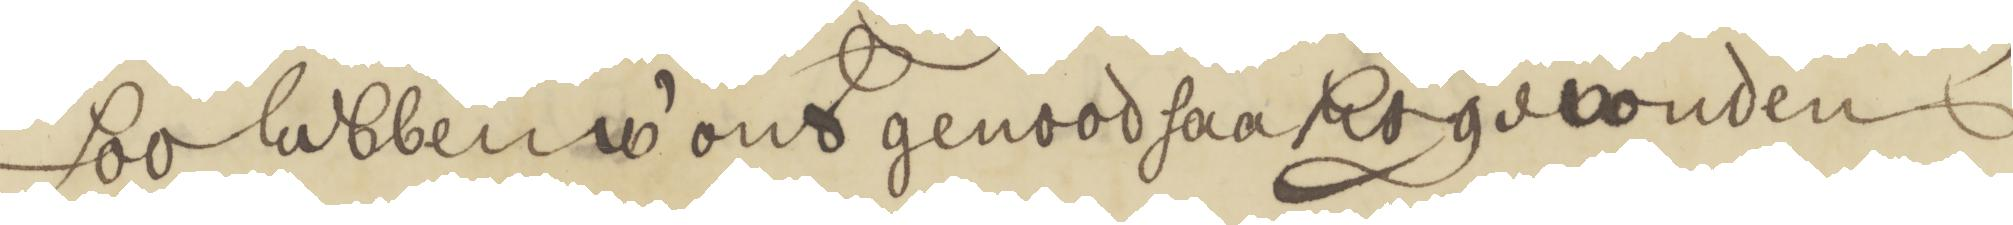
soo hebben w' ons genoodsaakt gevonden
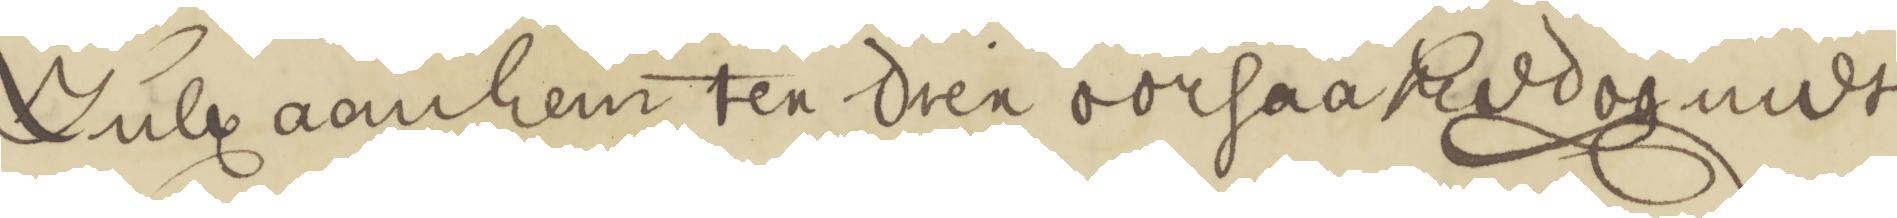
zulx aan hem ter dier oorsaake dog met
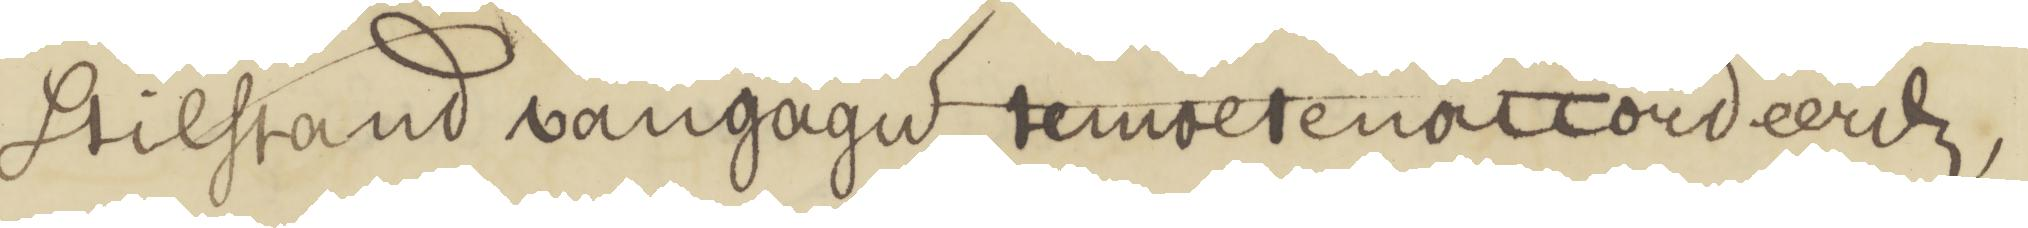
stilstand vangagie temoeten accordeeren,
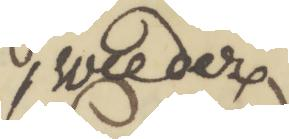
weeder
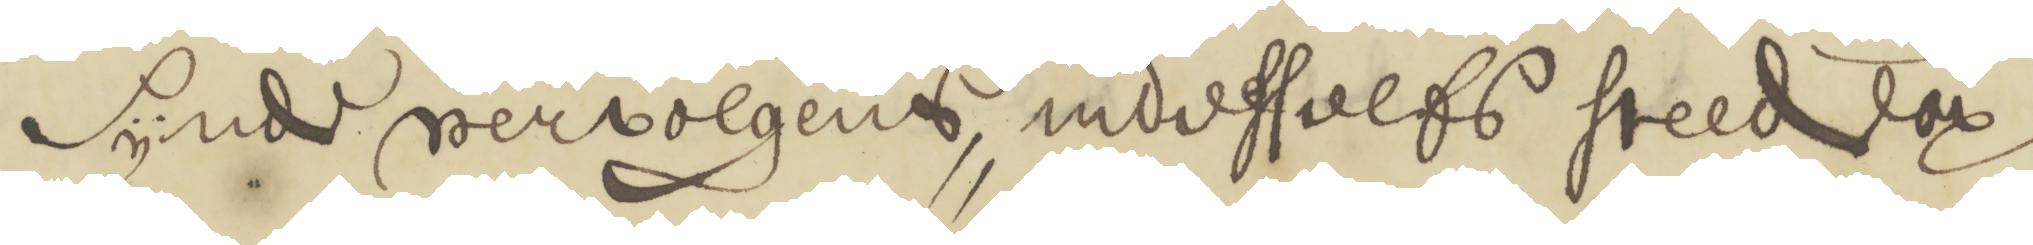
sijnde vervolgens„ in desselfs steede op
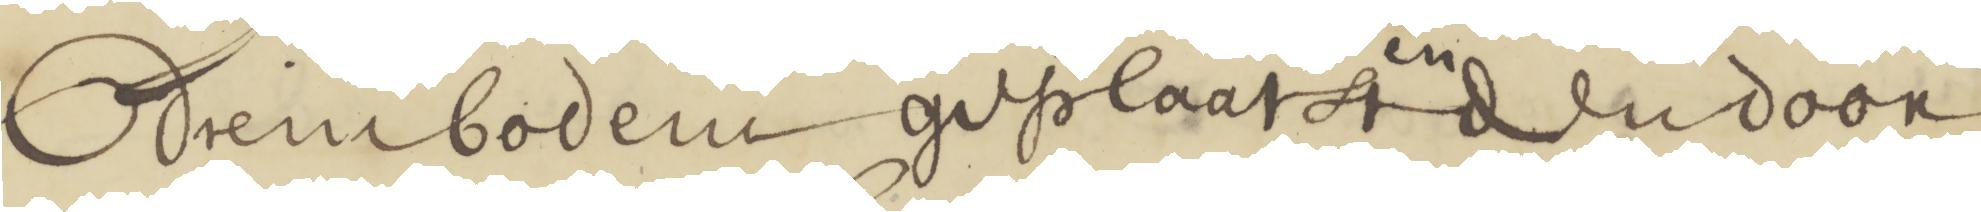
dien bodem geplaatst en den door
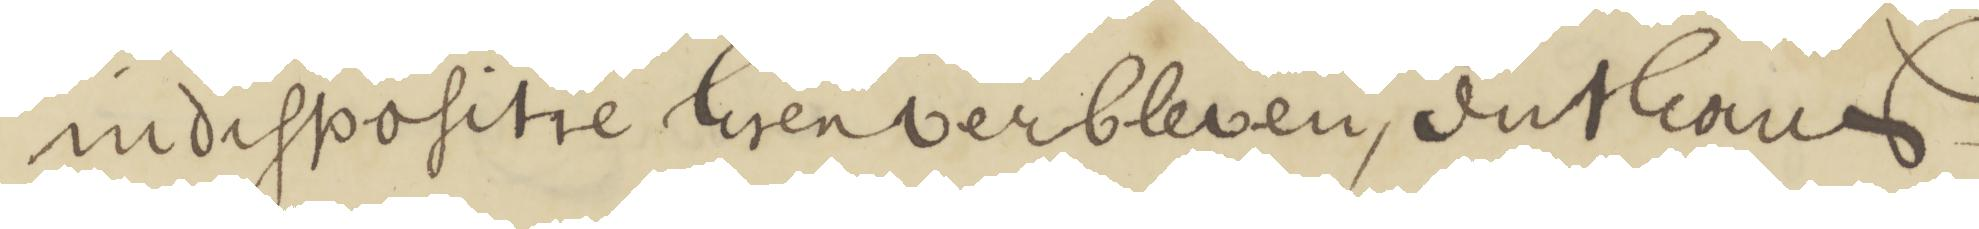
indispositie hier verbleven, en thans
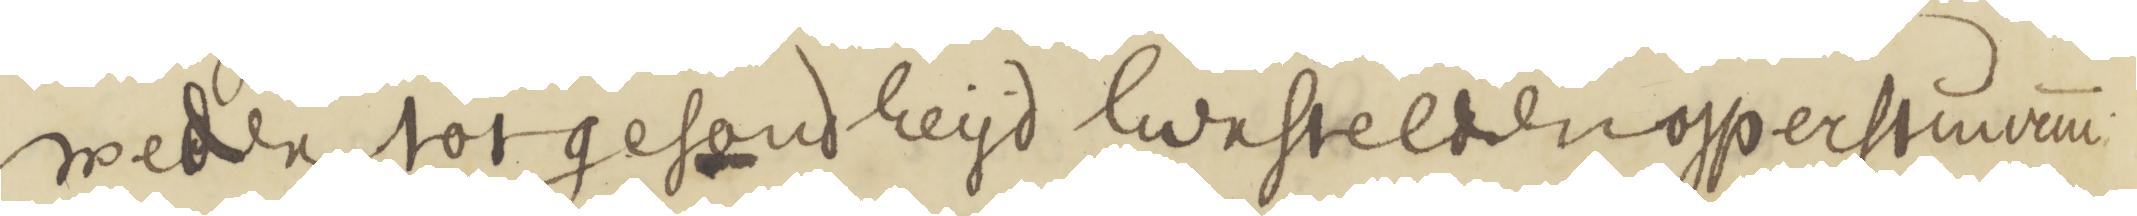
weder tot gesondheijd hersteld en opperstuurm:
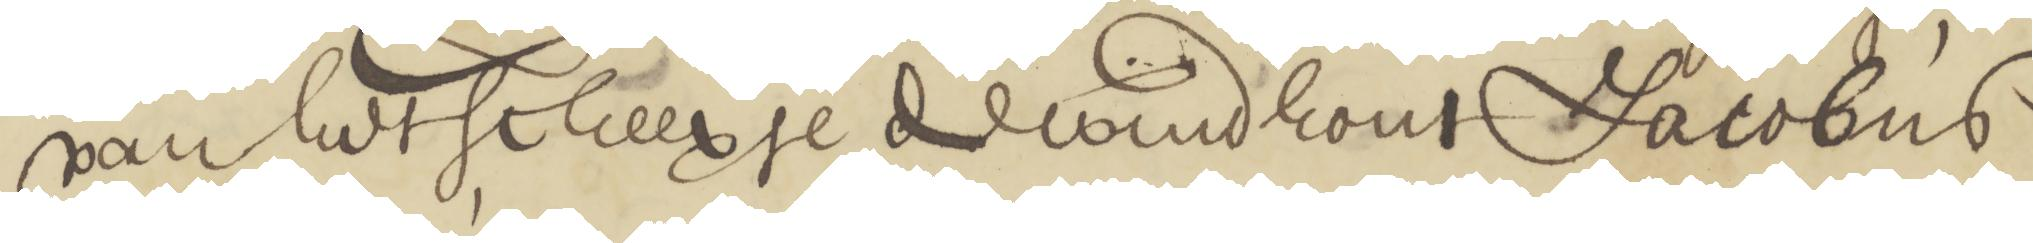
van het scheepje de windhout Iacobus
